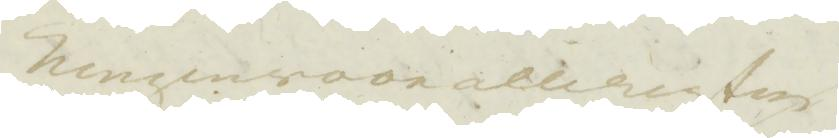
ningen voor alle regten
